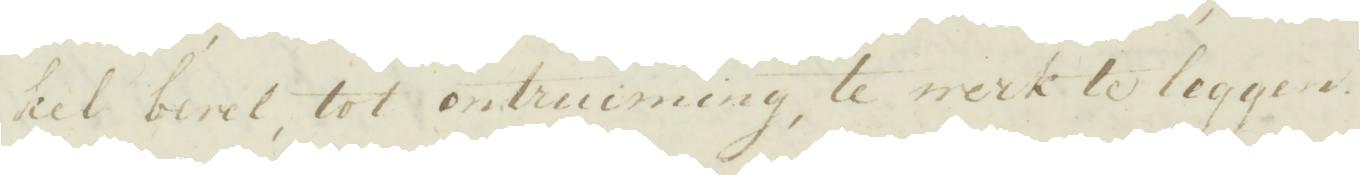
kel bevel, tot ontruiming, te werk te leggen.
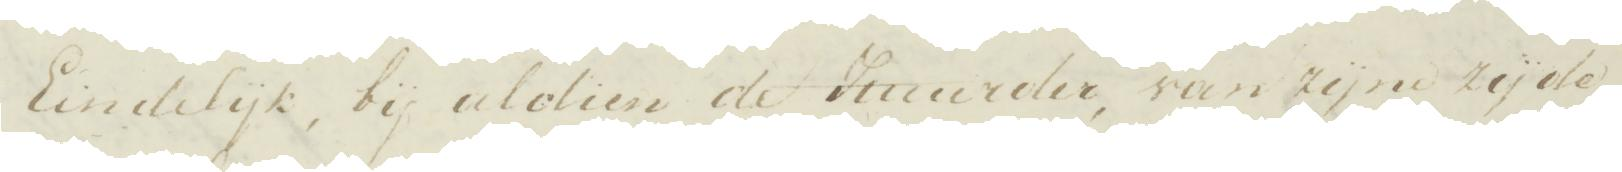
Eindelijk, bij aldien de Huurder, van zijne zijde,
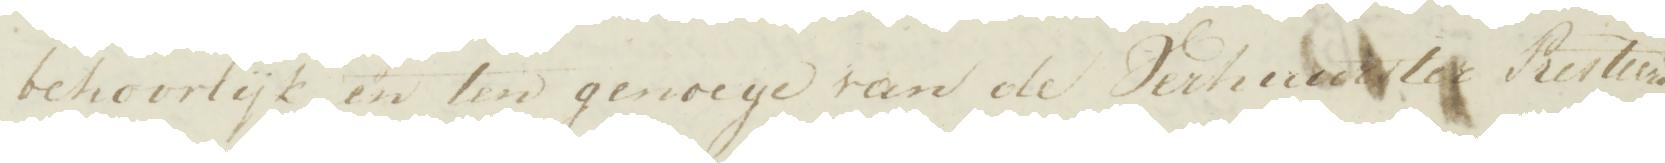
behoorlijk, en ten genoege van de Verhuurster Resteer,
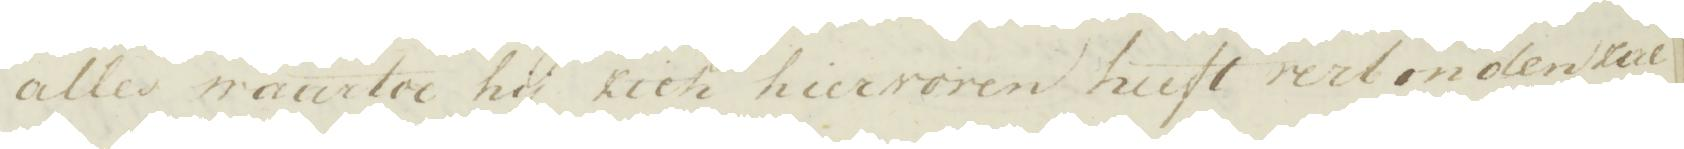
alles waartoe hij zich hier voren heeft verbonden, zal
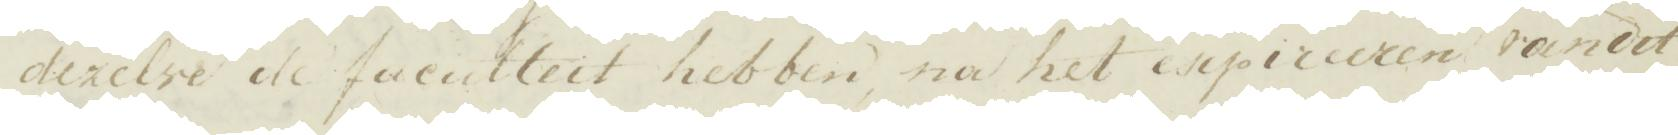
dezelve de faculteit hebben, na het expireeren van dit
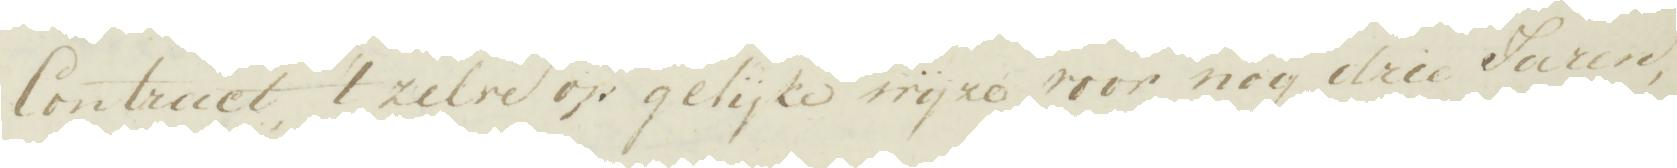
Contract, ’t zelve op gelijke wijze, voor nog drie Iaren,
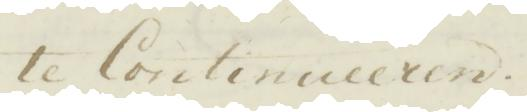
te Continueeren.
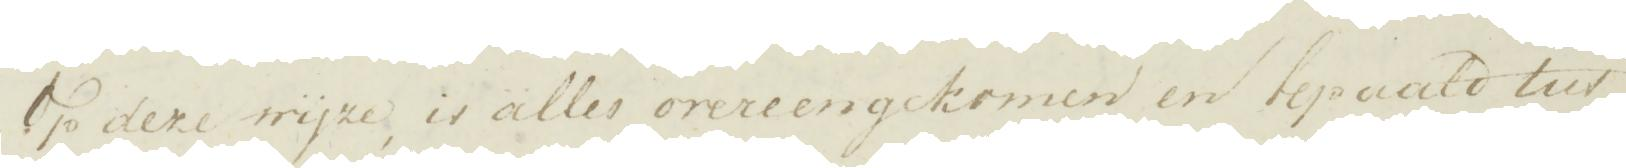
Op deze wijze, is alles overeengekomen en bepaald tus
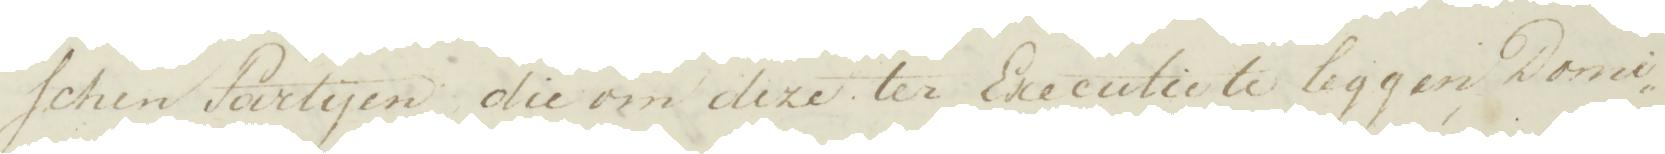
schen Partijen, die om deze ter Executie te leggen, Domi„
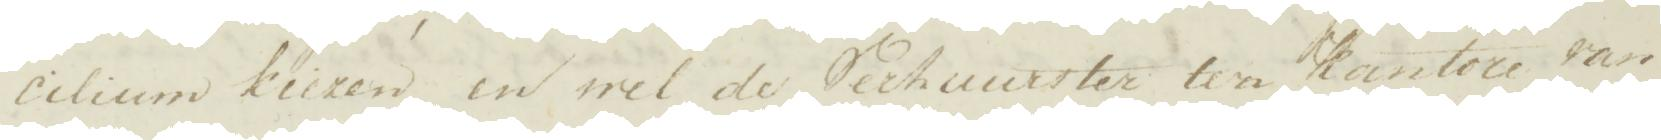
cilium kiezen, en wel de Verhuurster ten Kantore van
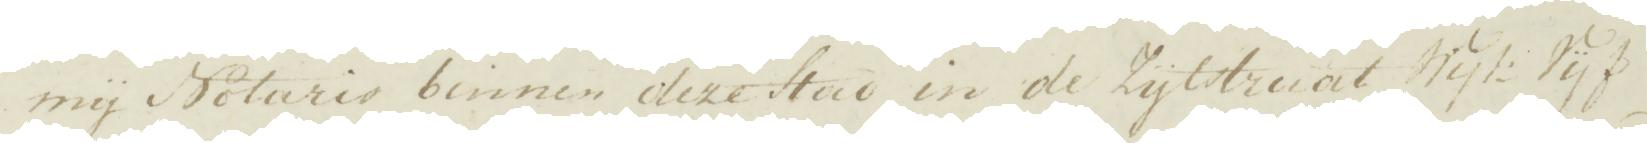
mij Notaris binnen deze stad, in de Zijlstraat Wyk Vijf
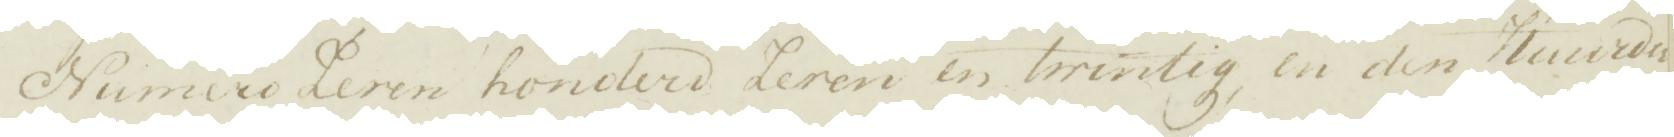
Numero Zeven honderd Zeven en twintig, en den Huurder
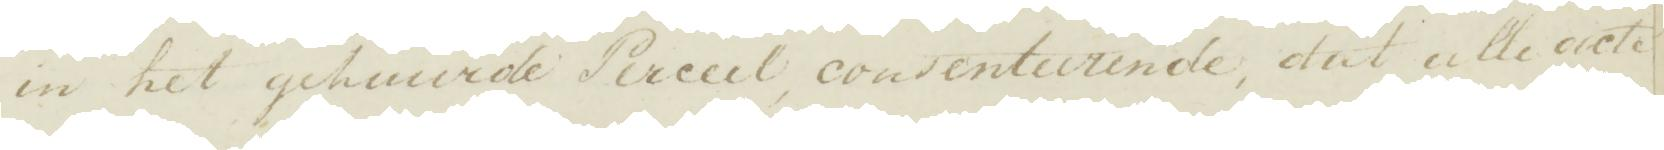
in het gehuurde Perceel, consenteerende, dat alle acte
